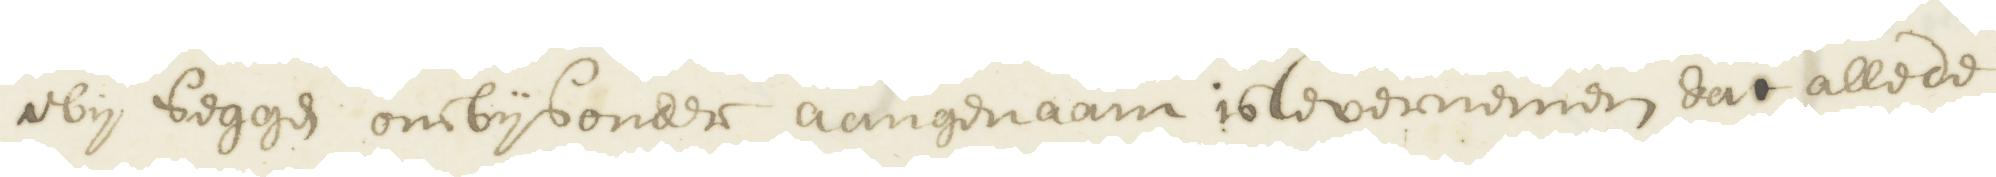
wij seggen ons bijsonder aangenaam is tevernemen dat alle de
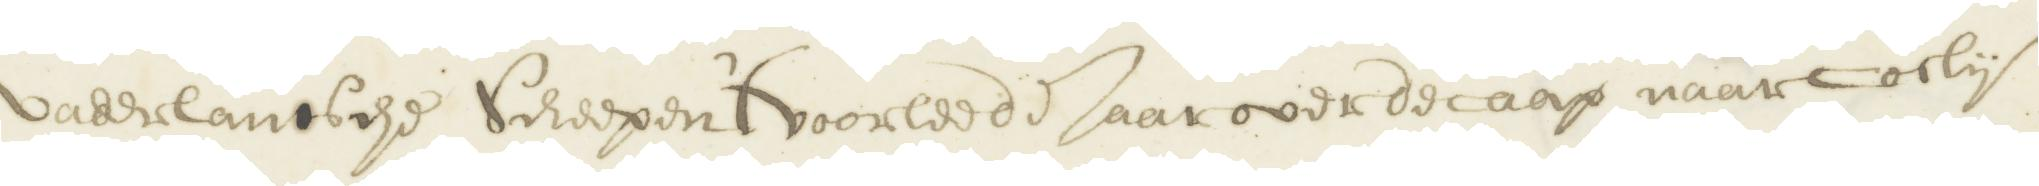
vaderlantsche scheepen voorleede Jaar over de caap naar corbij
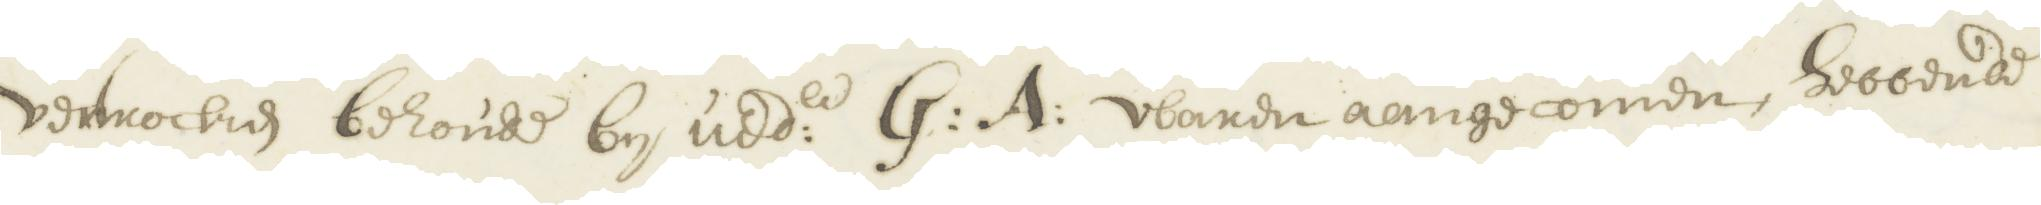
vertrocken behoude by uEd:le G:A: waren aangecomen, hebbende
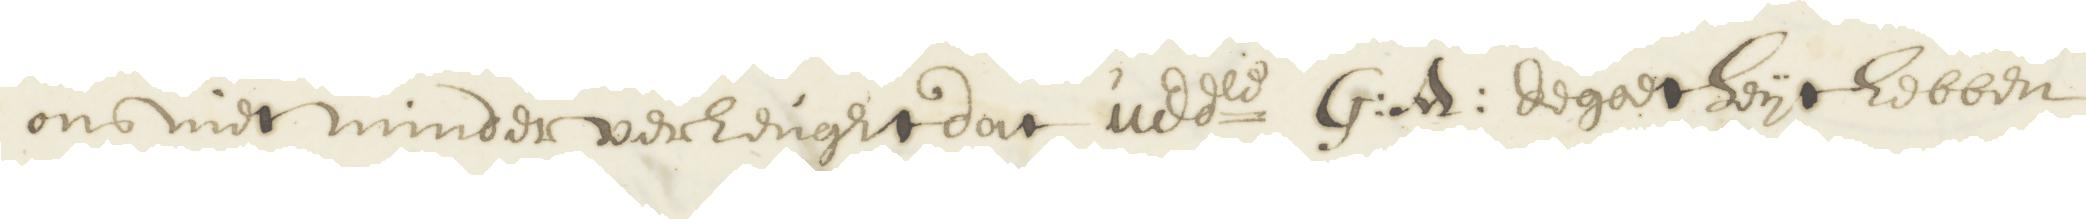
ons niet minder verheught dat uEd=le G:A: de goetheijt hebben
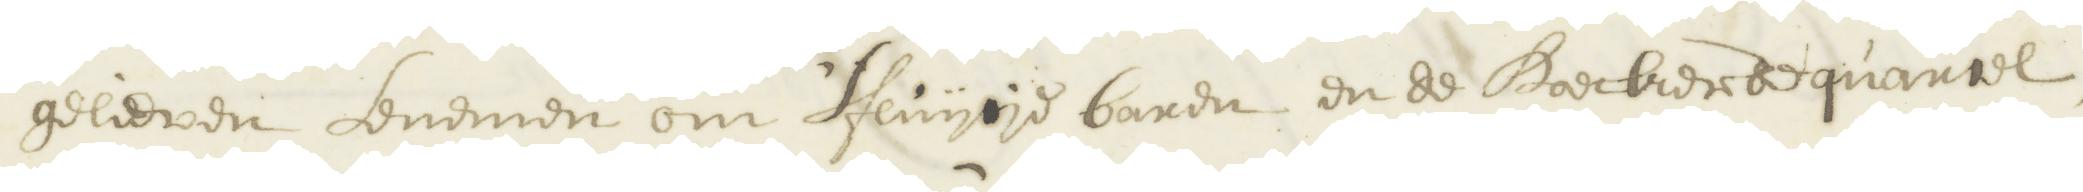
gelieven tenemen om 'tfluijtje baren en de Boecker de quartel,
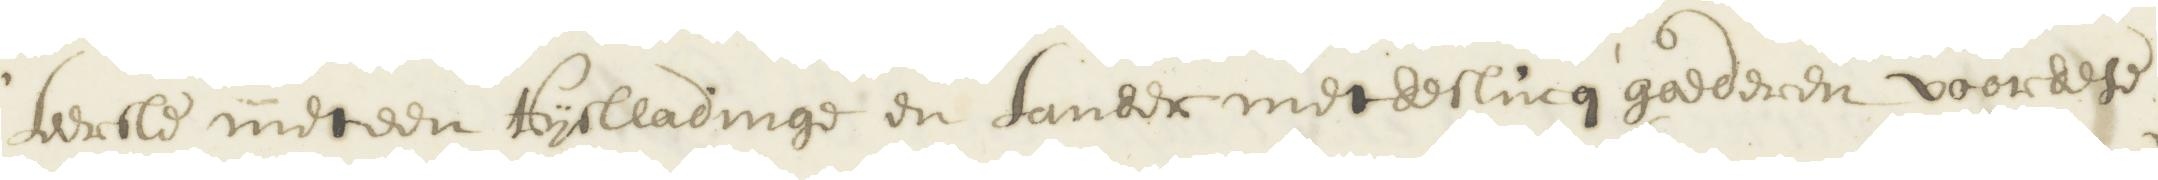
't eerste met een Rijstladinge en 'tander met de slucq 'goederen voor dese
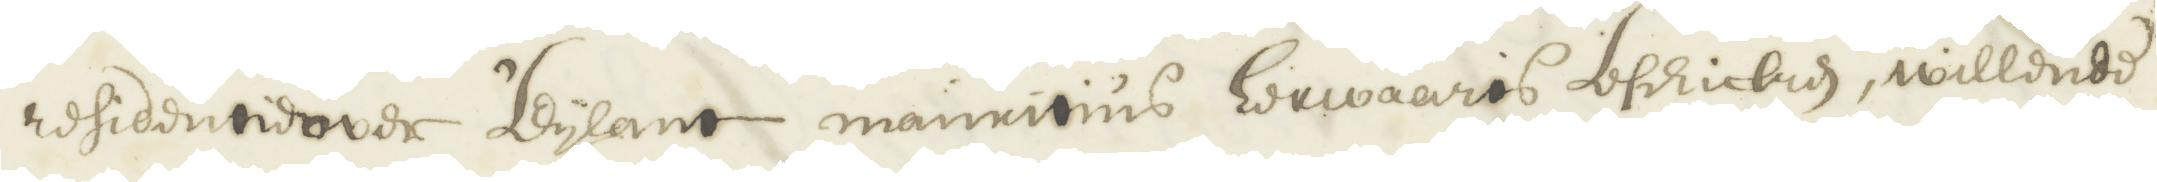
residentie over 'tEijlant mauritius herwaarts teschicken, willende
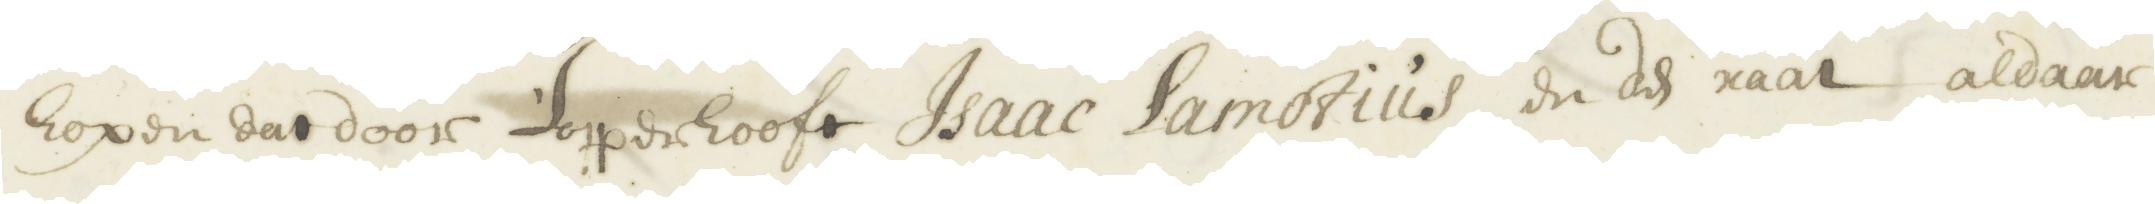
hopen dat door 'topperhooft Jsaac Samotius en den raat aldaar
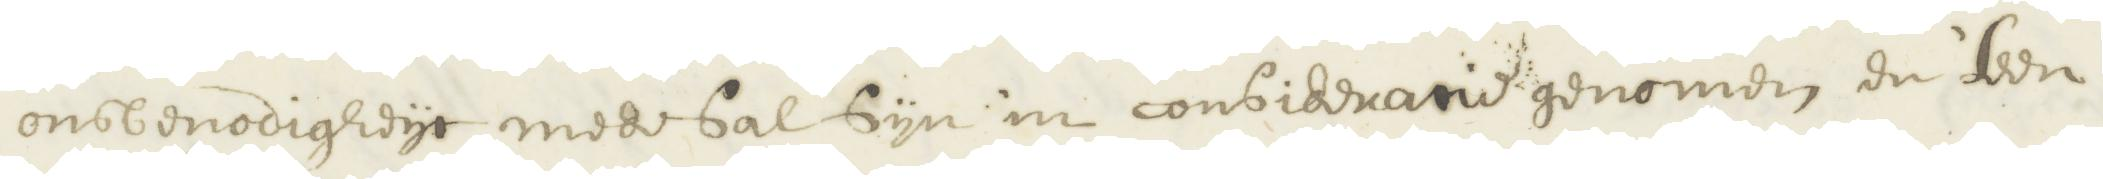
ons benodigheijt mede sal sijn in consideratie genomen en 'teen
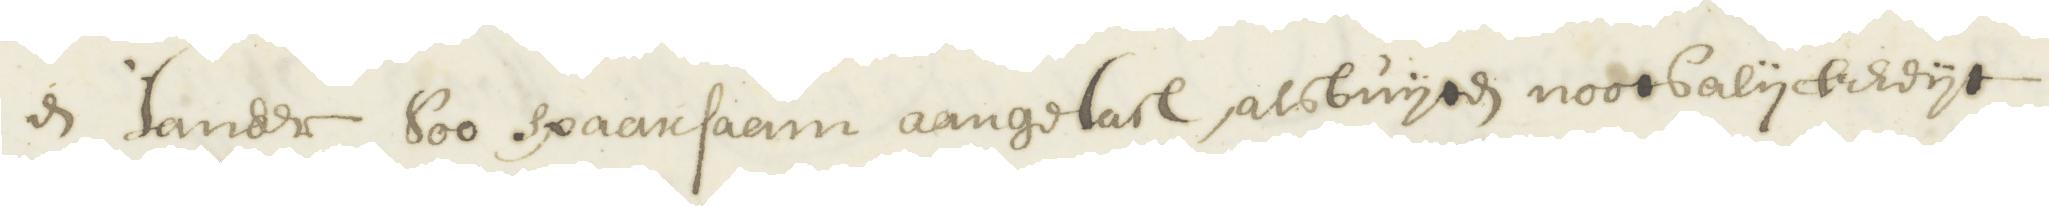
en 'tander soo spaarsaam aangetast, als buijten nootsalijckheijt
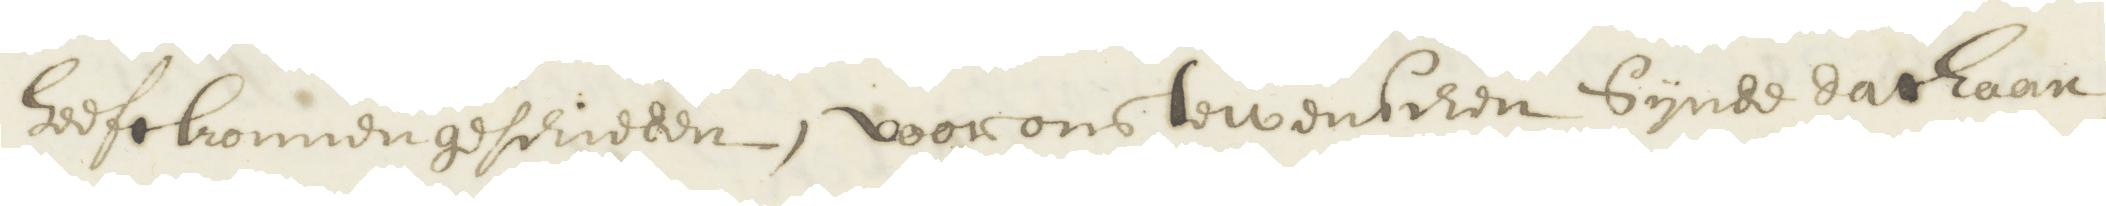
heeft konnen geschieden, voor ons tewenschen sijnde dat haar
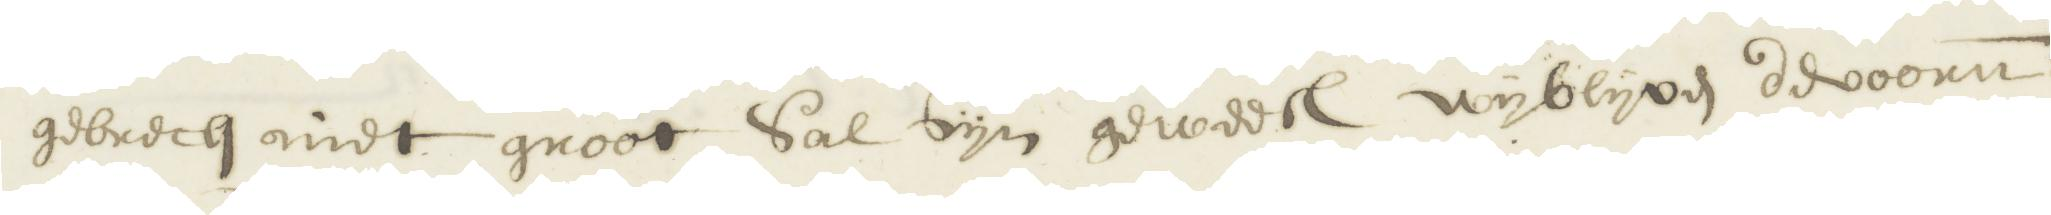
gebrecq niet groot sal sijn geweest wij blijven devoorn:
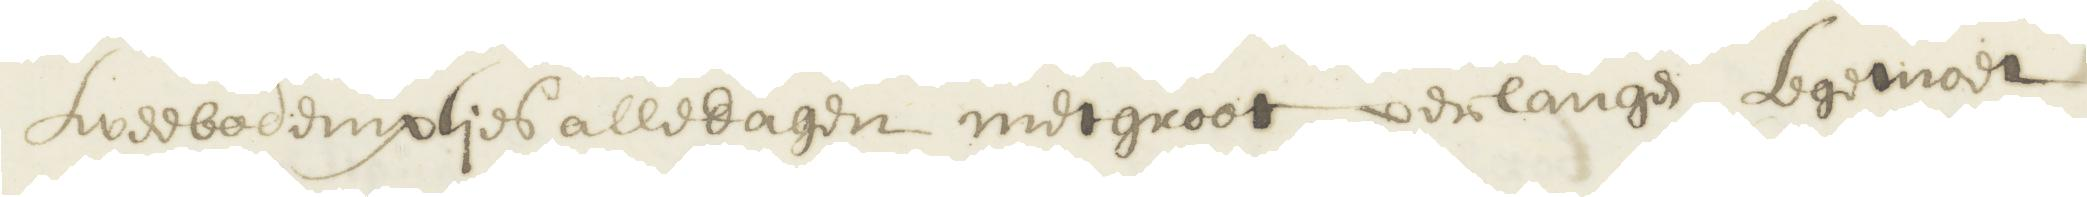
tweebodemptjes alle dagen met groot verlangen tegemoet
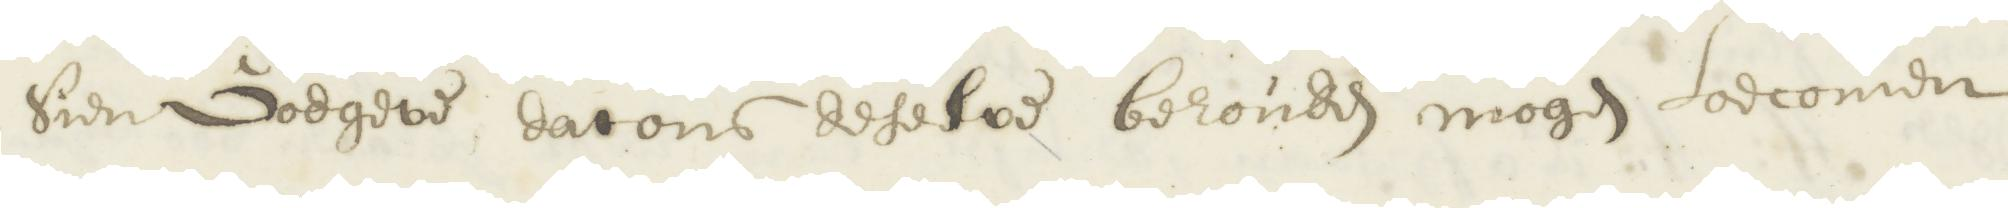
sien Godgeve dat ons deselve behouden mogen toecomen
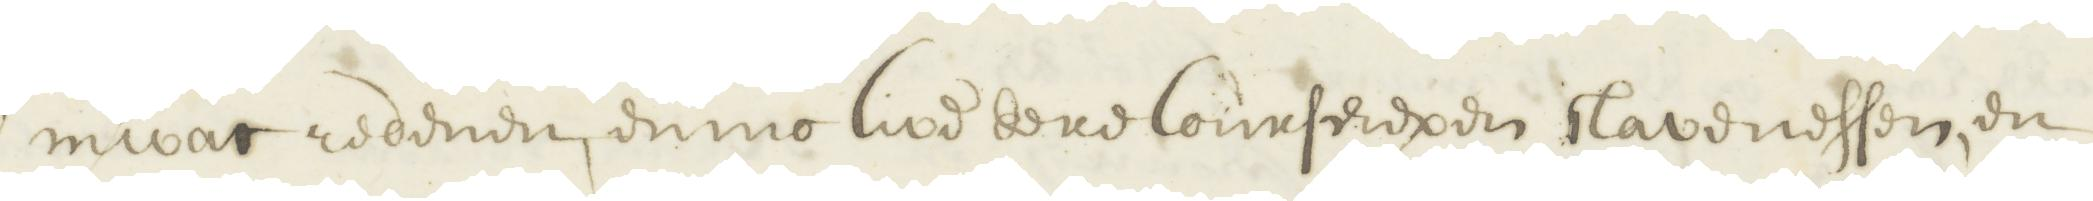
Omwat redenen en motive de retourschepen stavenessen, en
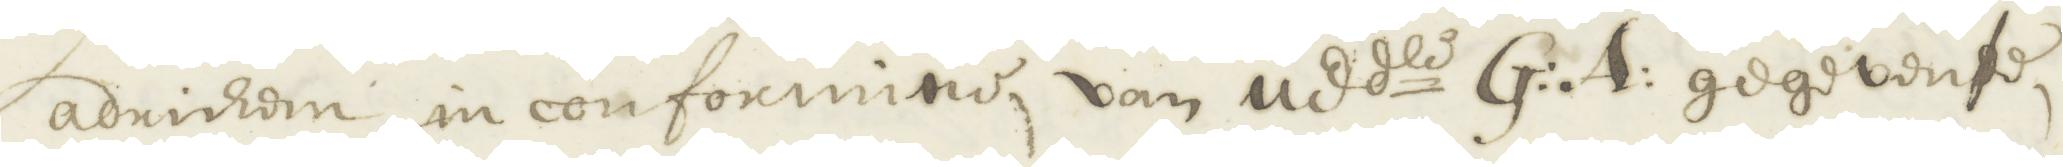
adrichem in conformitie van uEd=le G:A: gegevende,
